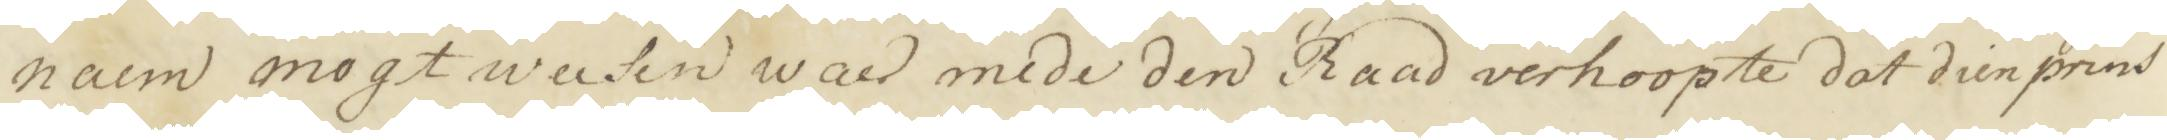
naem mogt weesen waer mede den Raad verhoopte dat dien prins
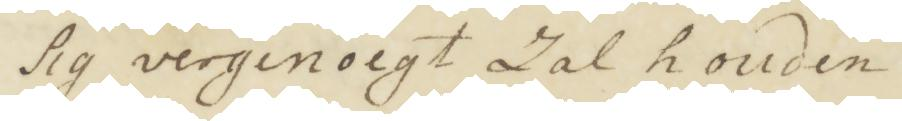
sig vergenoegt zal houden
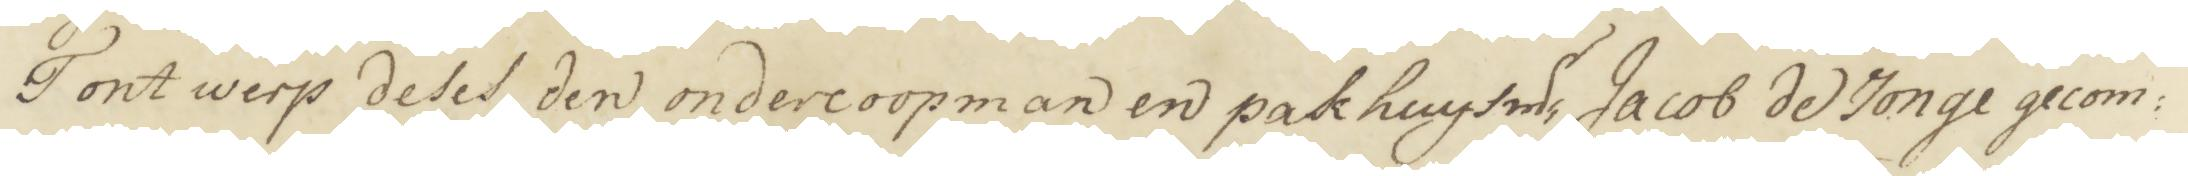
T ont werp deses den ondercoopman en pakhuysm„r Jacob de Ionge gecom:
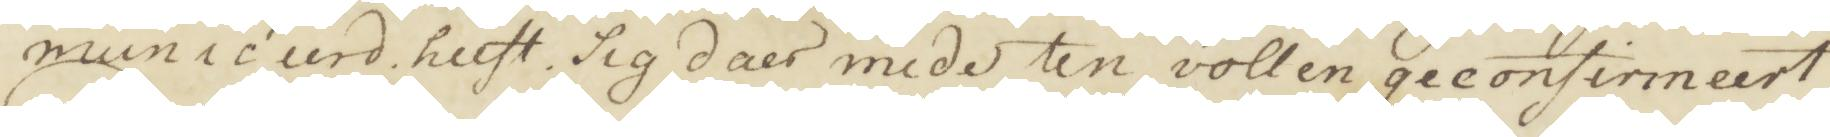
municeerd heeft sig daer mede ten vollen geconfirmeert
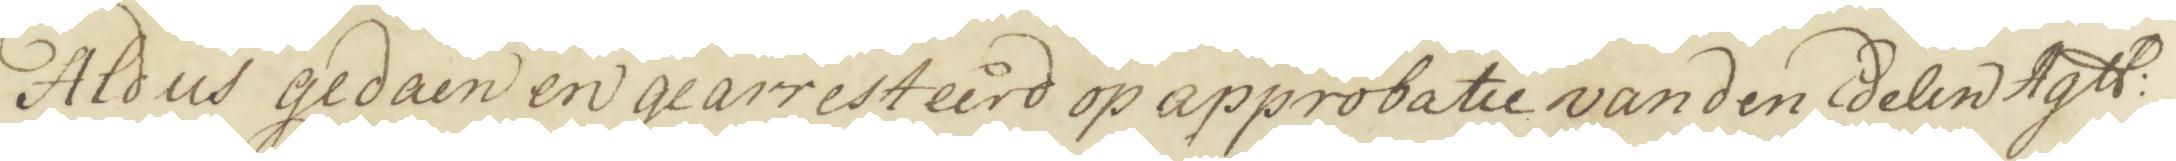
Aldus gedaen en gearresteerd op approbatie van den Edelen Agtb:
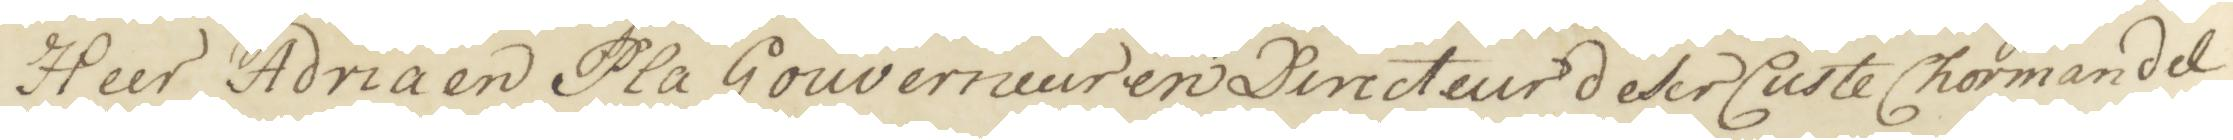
Heer Adriaen Pla Gouverneur en Directeur deser Custe Chormandel
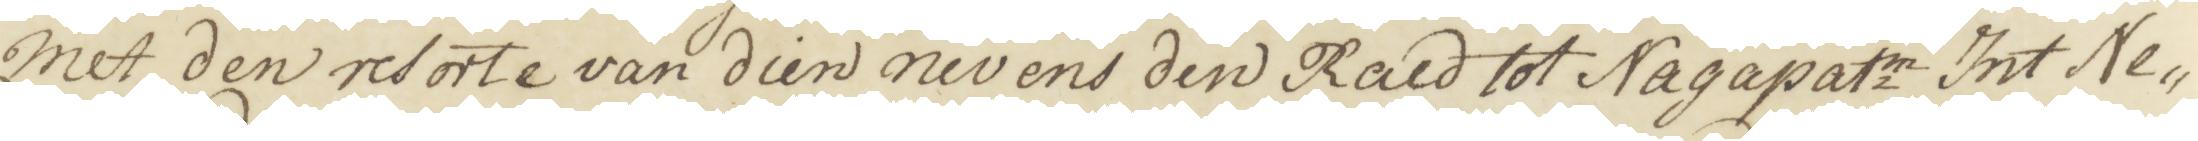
met den resorte van dien nevens den Raed tot Nagapat=m Int Ne„
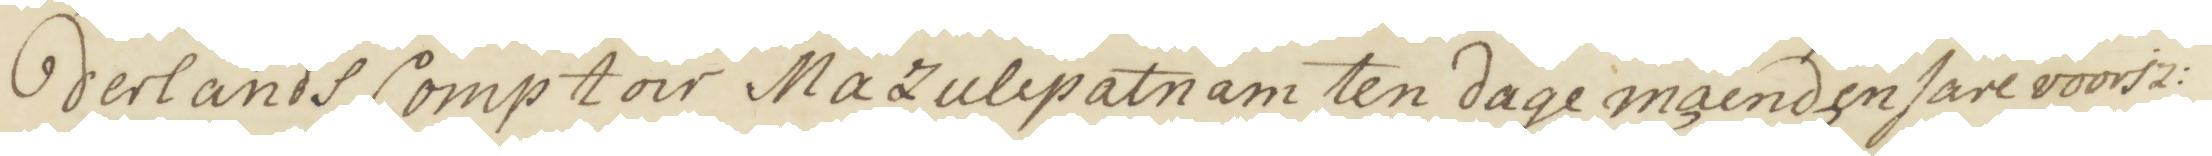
derlands Comptoir Mazulipatnam ten dage maend en Jare voorsz:
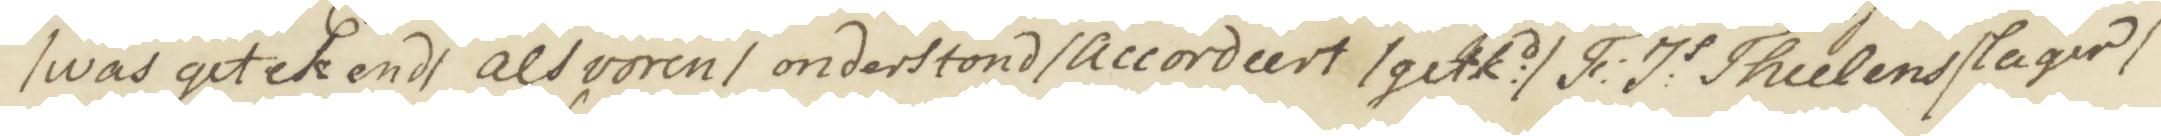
/was getekend/ als voren /onderstond / accordeert /getk:d/ F: J:s Theelens /lager/
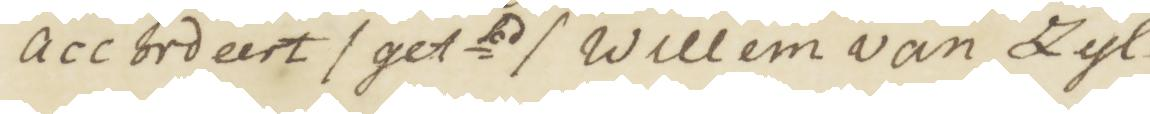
accordeert / get=kd / Willem van Zyl
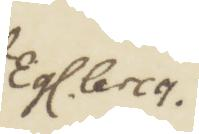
EgClercq.
